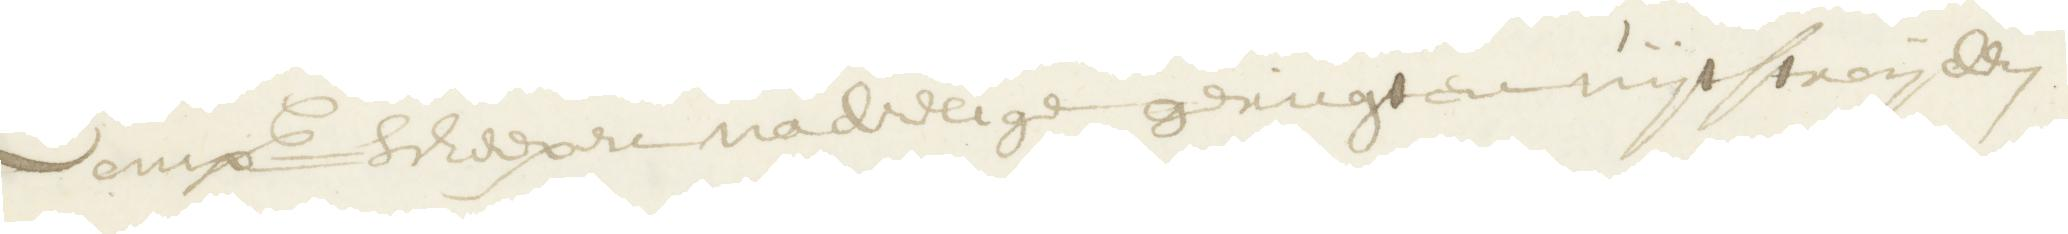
Comp:s scheepen nadeelige gerugten uijtstroijden
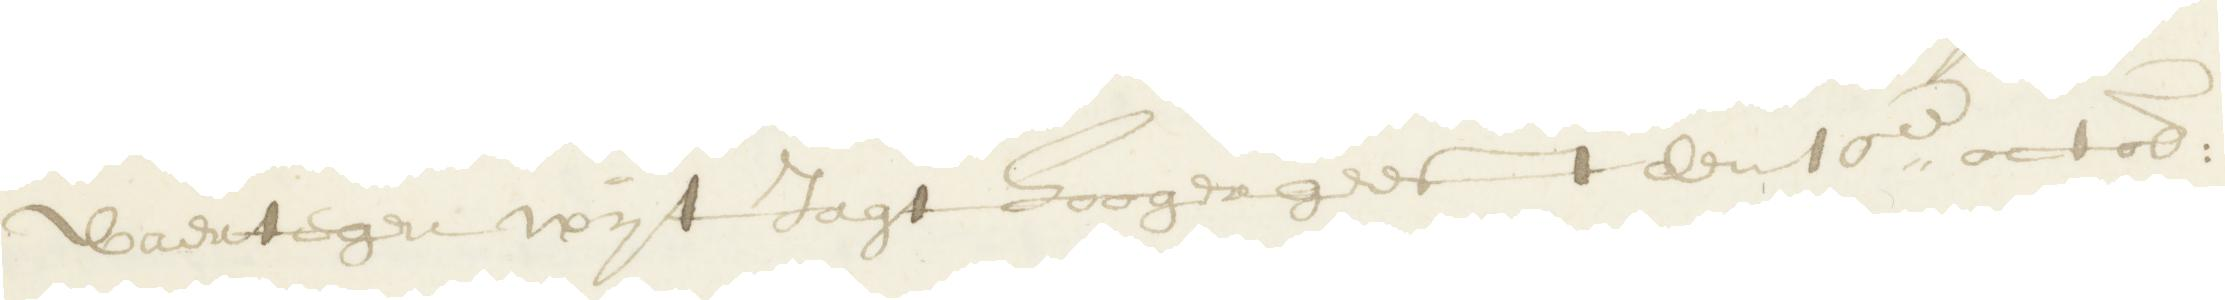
vaertegen wijt Iagt Hoogergeest den 10:e octob:
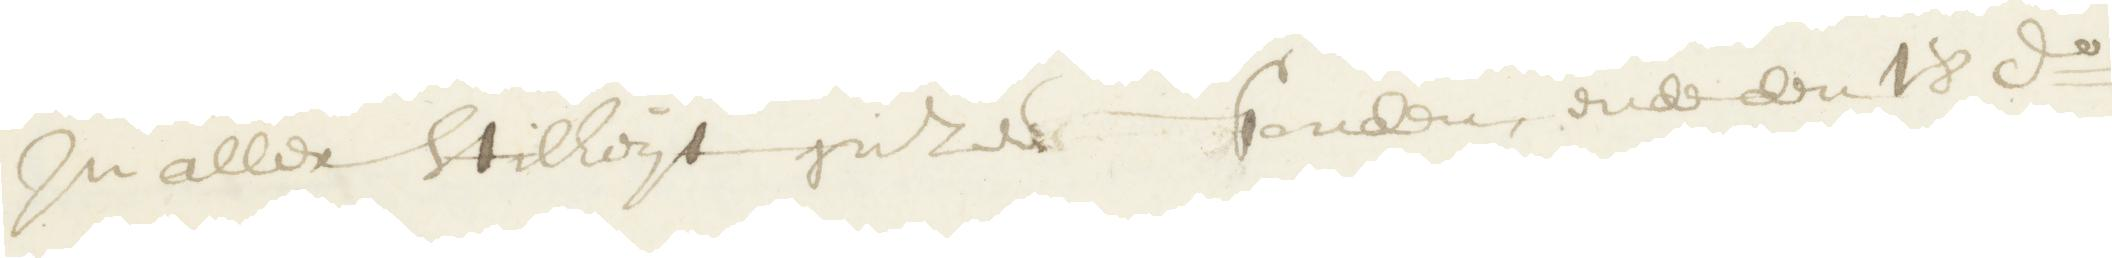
Jn aller stilheijt jn zee sonden, ende den 18 d=o
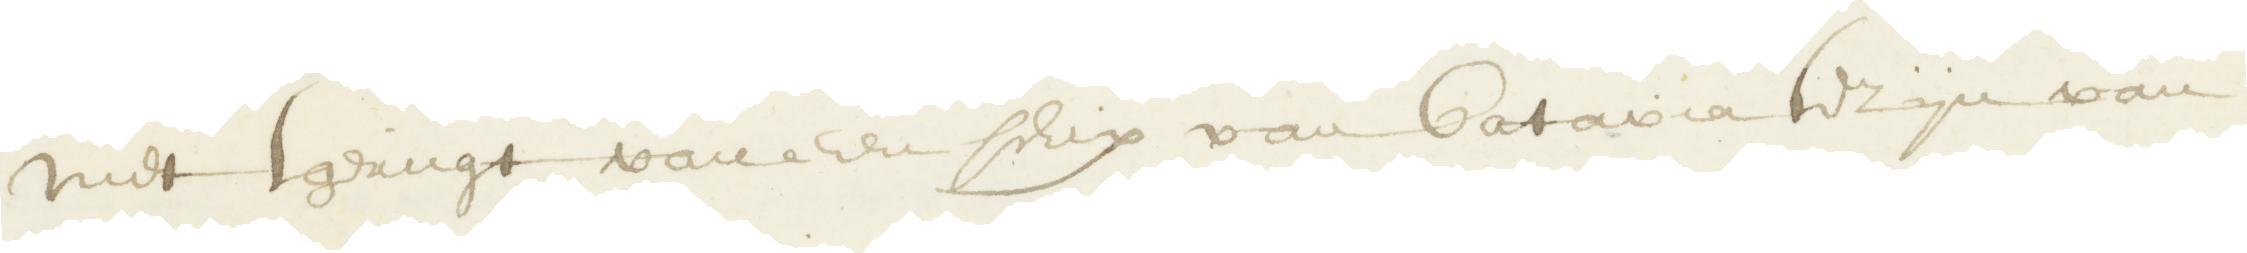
met tgerugt van een schip van batavia tezijn van
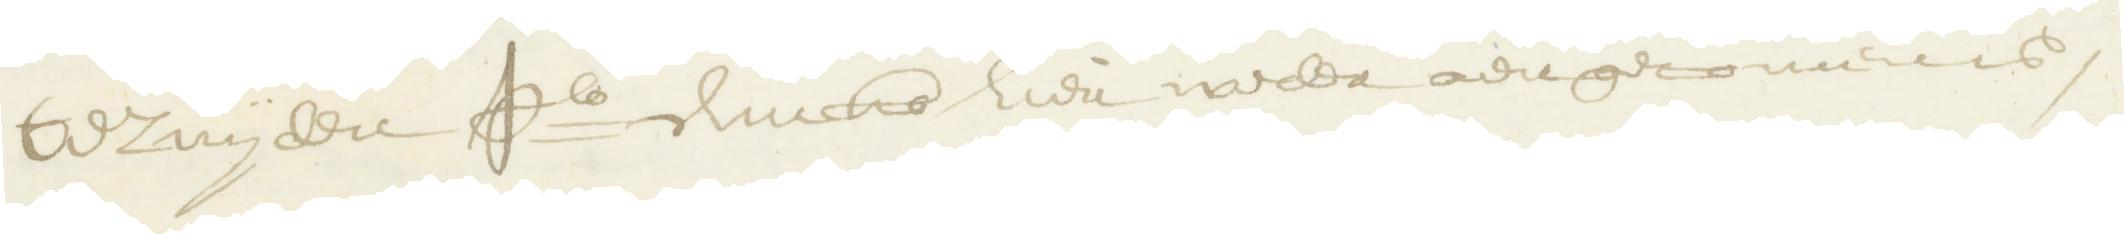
bezuijden p=lo chincko hier weder aengecomen is,
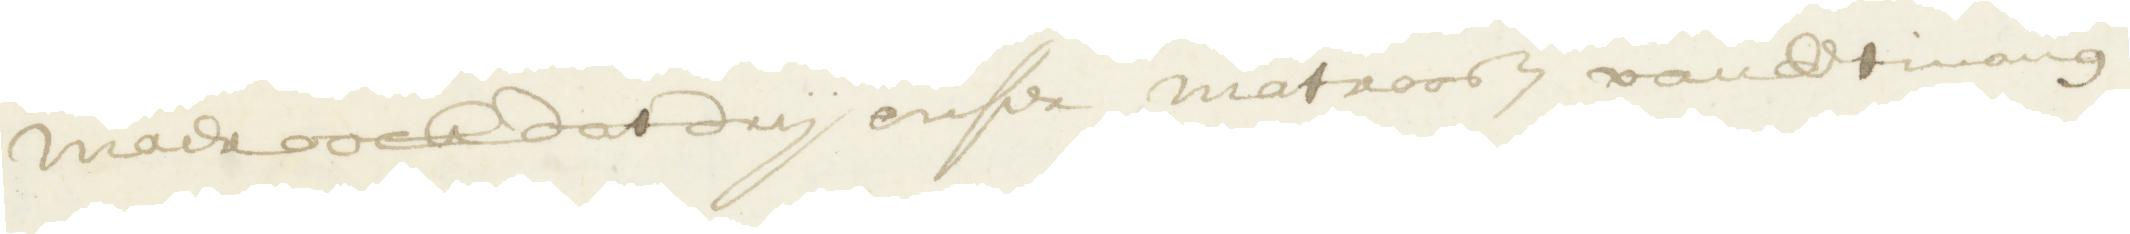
maer oock dat drij onser matroosen, van detinang
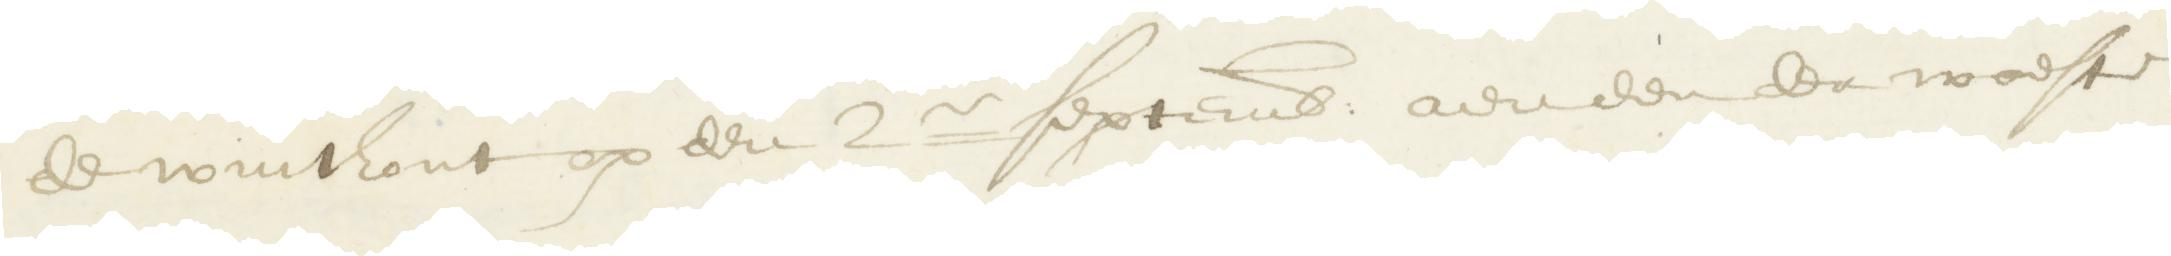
de winthont op den 2-' septemb: aen een der woeste
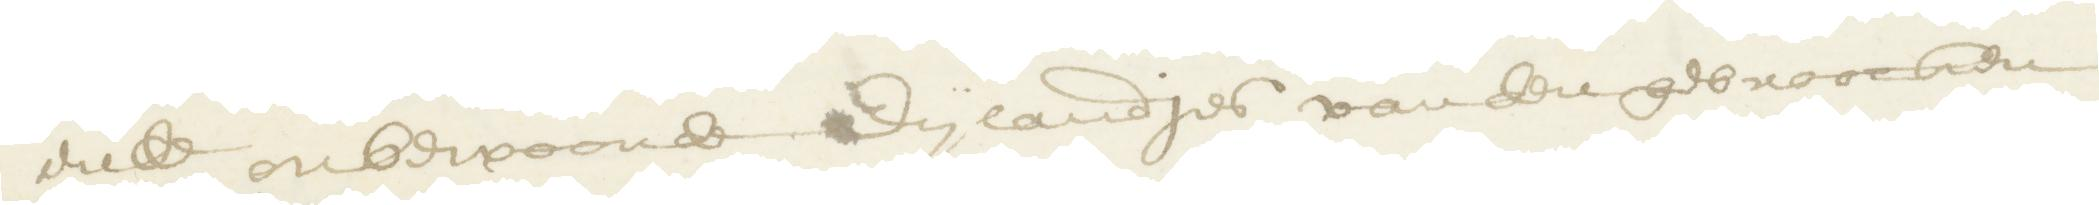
ende onbewoonde Eijlandjes van den gebroocken
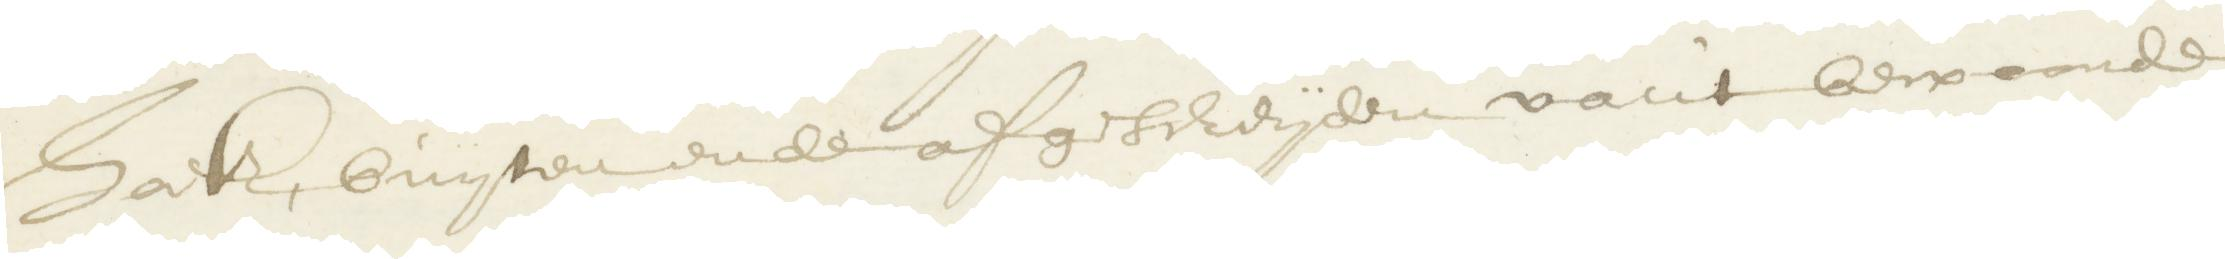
Hoek, buijten ende afgescheijden van’t bewoonde
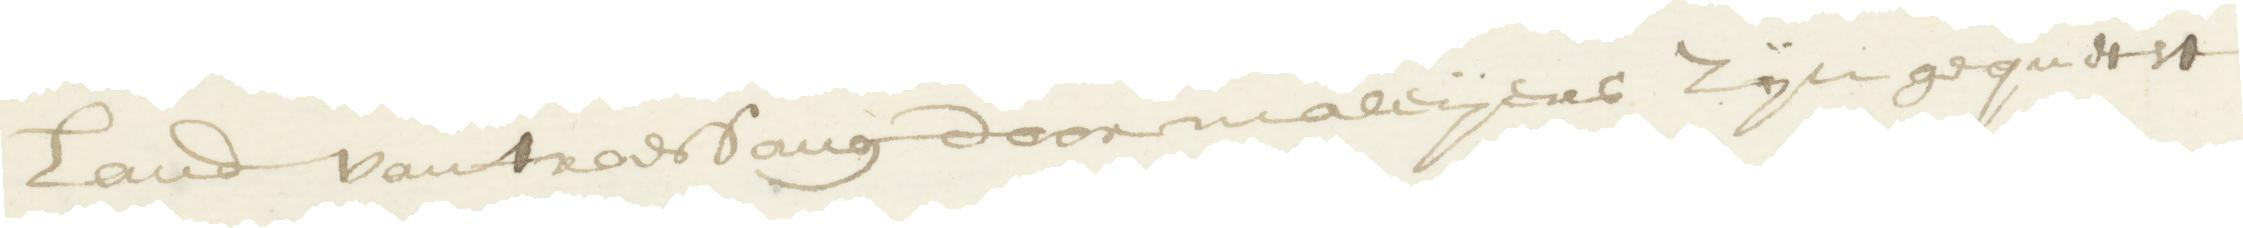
Land van troessang door maleijers Zijn gequetst
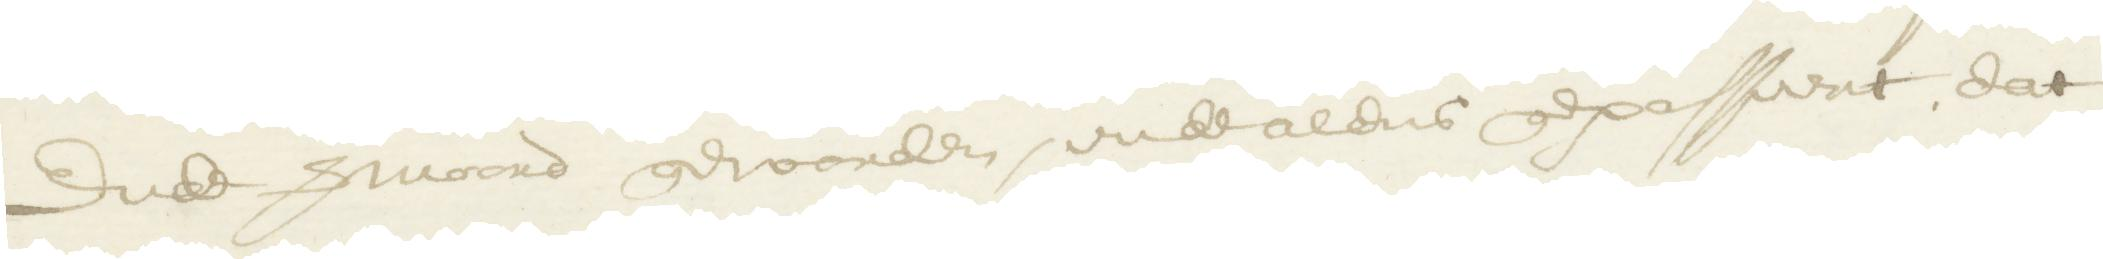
Ende vemoord geworden, ende aldus gepassseert, dat
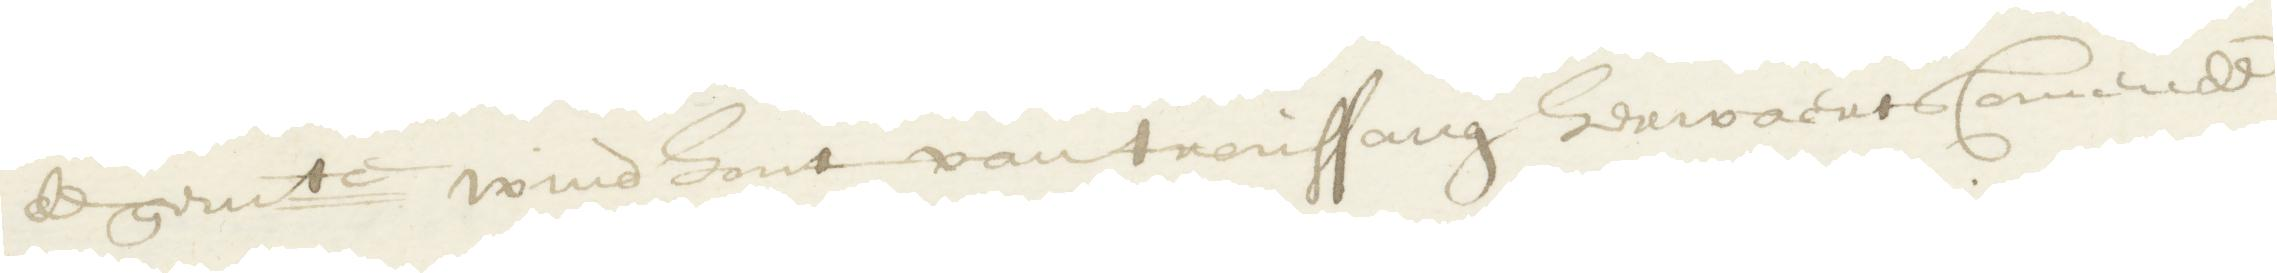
de gem:te windhont van troussang herwaerts comende
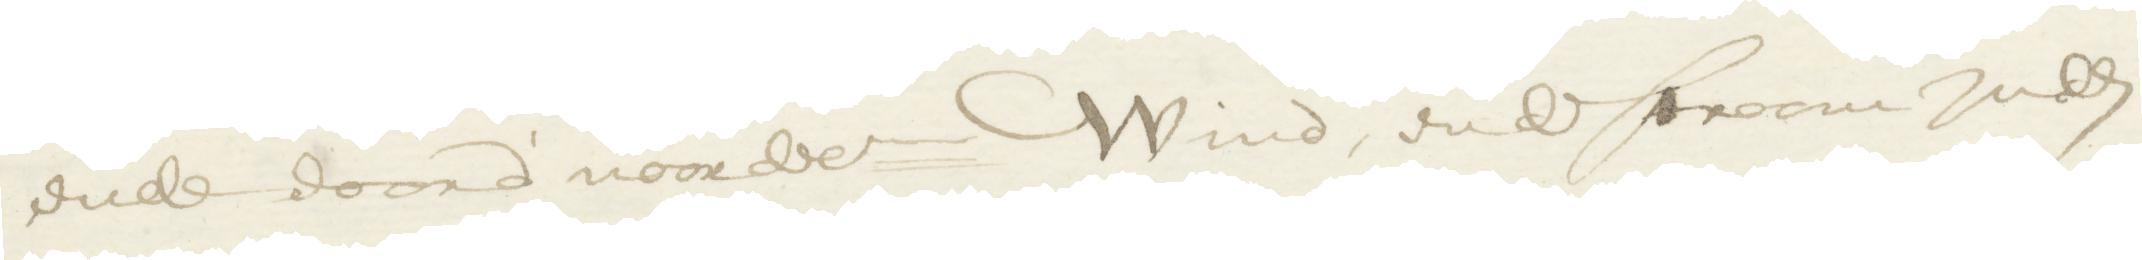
ende door d' noordelijke Wind, en de stroom Jnden
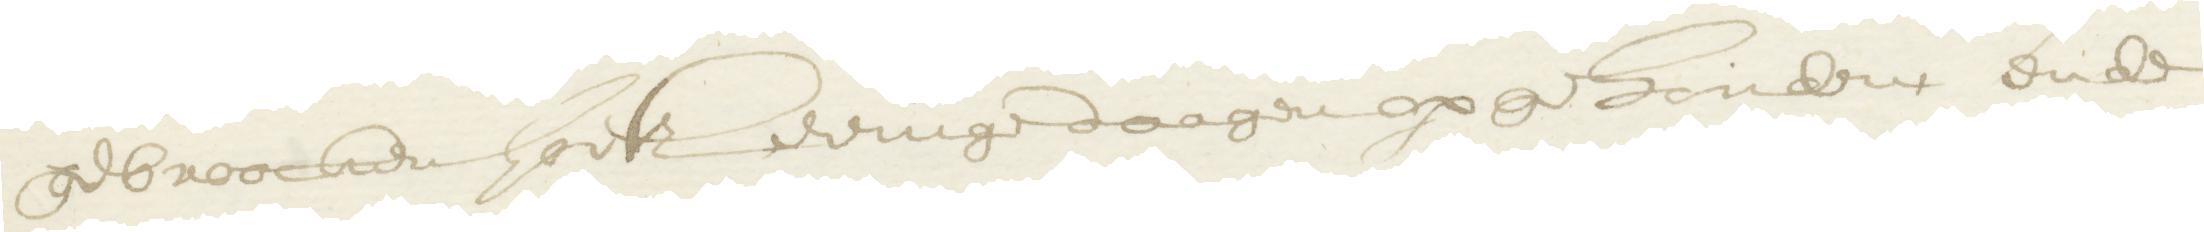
gebroocken hoek eenige daagen op gehoude ende
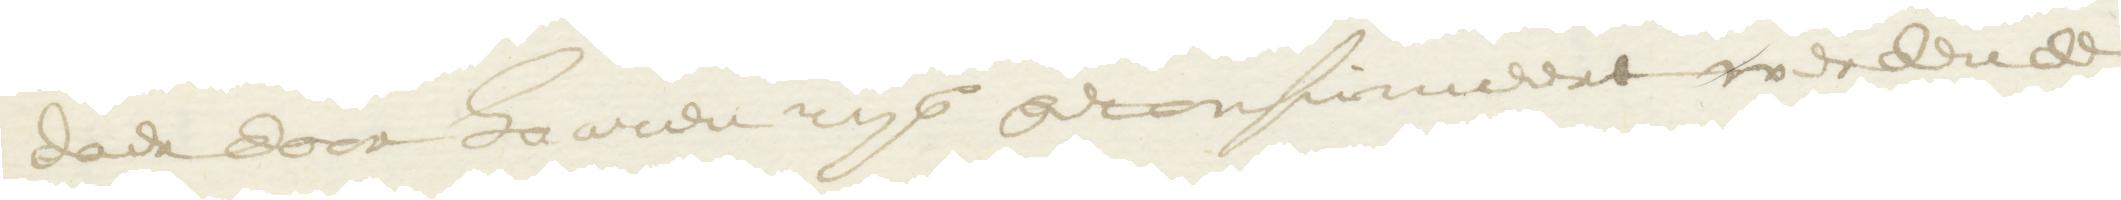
daer door haaren rijs geconfirmeert werdende
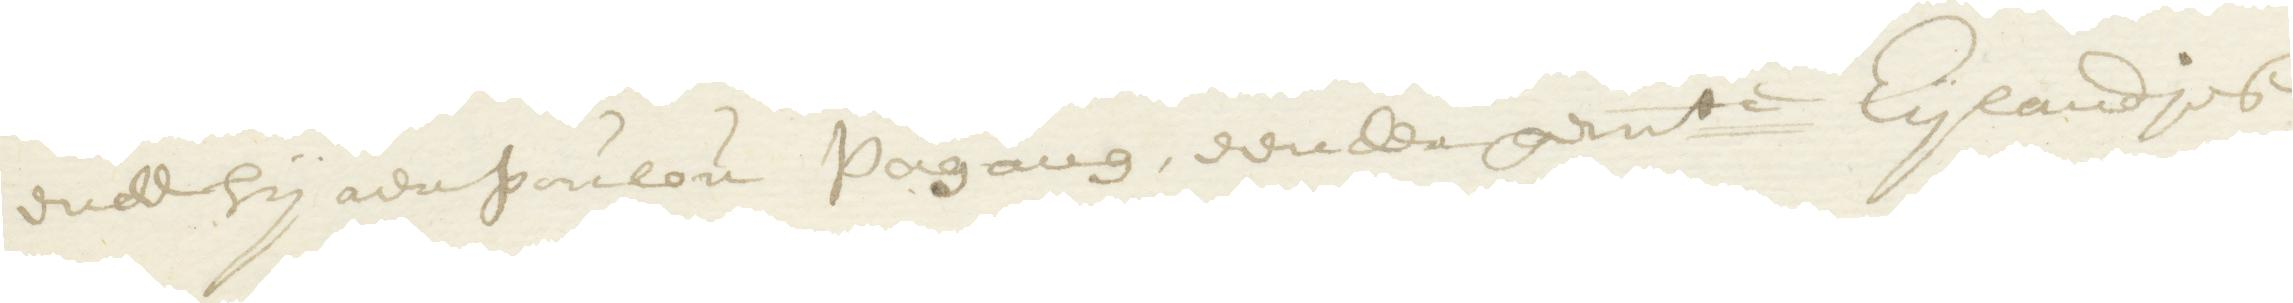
ende sij aenpoulou pagang, eender gem:te Eijlandjes
